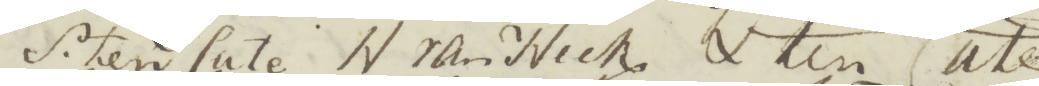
S ten Cate W van Heek L ten Cate
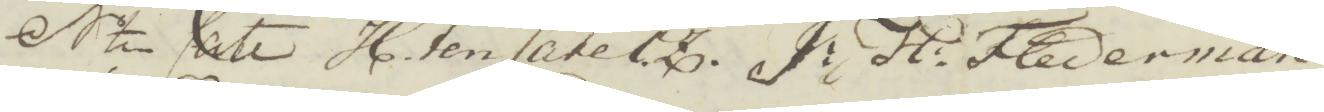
N ten Cate H. ten Cate C. Z„ J: H: Flederman
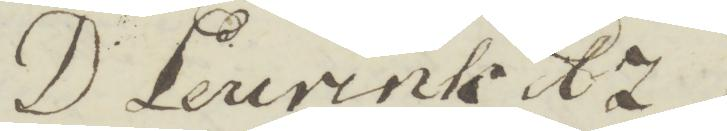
D Leuvink Az
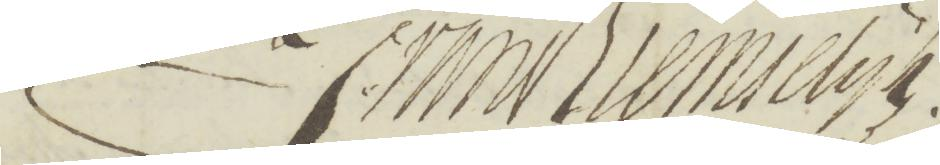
J: van Riemsdijk.
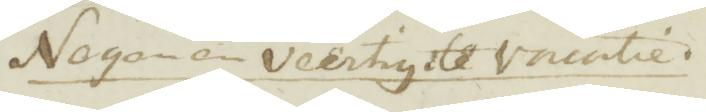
Negen en Veertig de vacatie
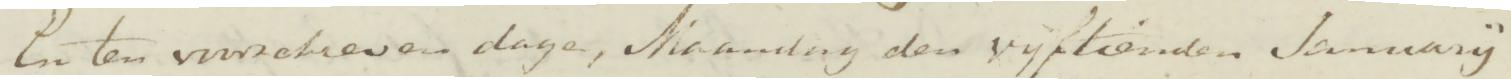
En ten voorschreven dage, Maandag den vijftienden Ianuarij
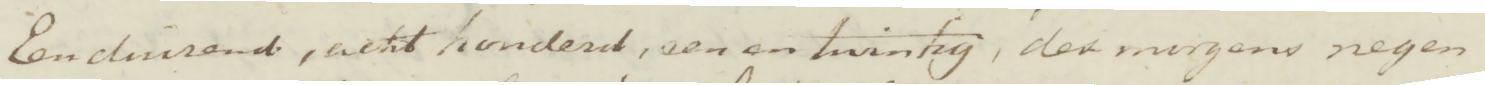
Een duizend, acht honderd, een en twintig, der morgens negen
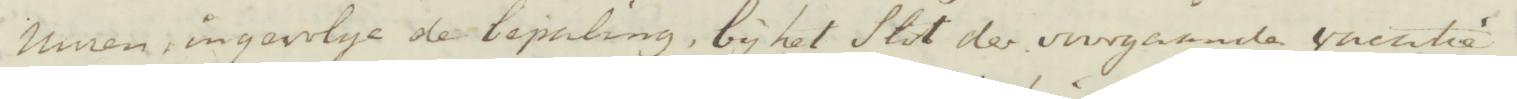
uuren, ingevolge de bepaling, bij het slot der voorgaande vacatie
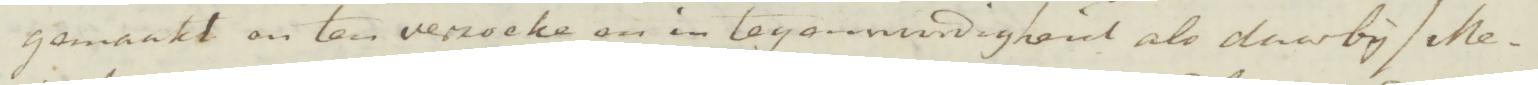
gemaakt en ten verzoeke en in tegenwoordigheid als daarbij / Me„
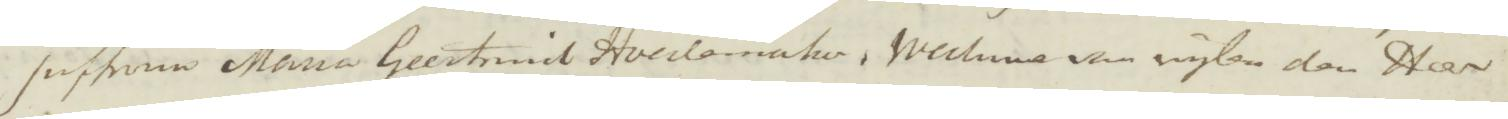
Juffrouw Maria Geertruid Hoedemaker, Weduwe van wijlen den Heer
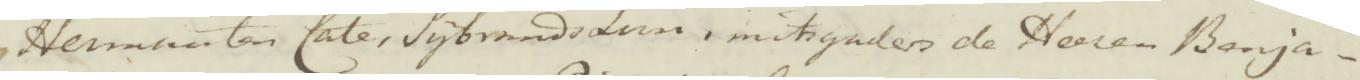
„Herman ten Cate, Sijbrands Zoon, mitsgaders de Heeren Benja-
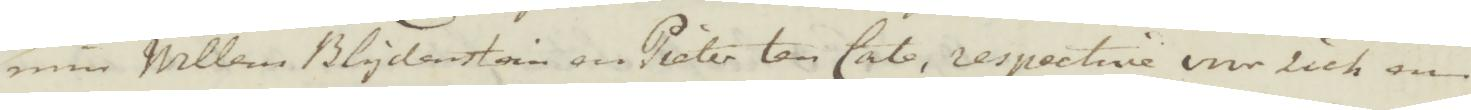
min Willem Blijdenstein en Pieter ten Cate, respective voor zich en
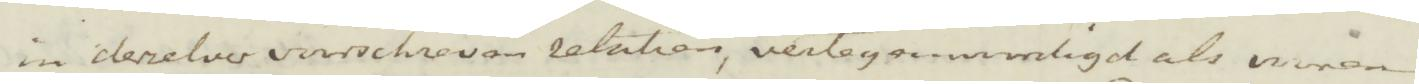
in dezelve voorschreven relatien, vertegenwoordigd als vooren
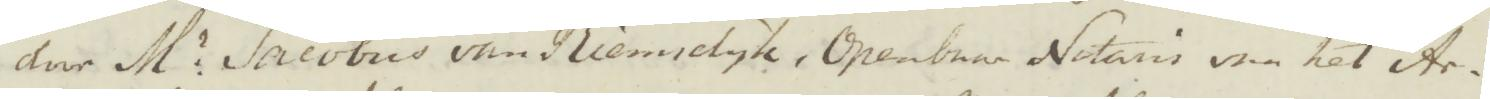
door M:r Jacobus van Riemsdijk, Openbaar Notaris van het Ar=
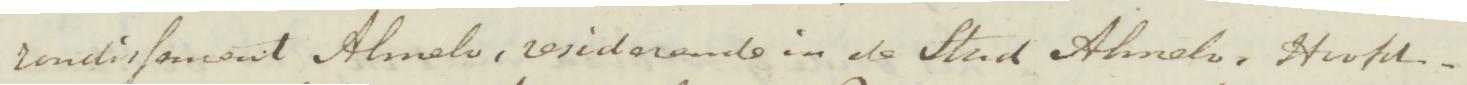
rondissement Almelo, residerende in de Stad Almelo, Hoofd.-
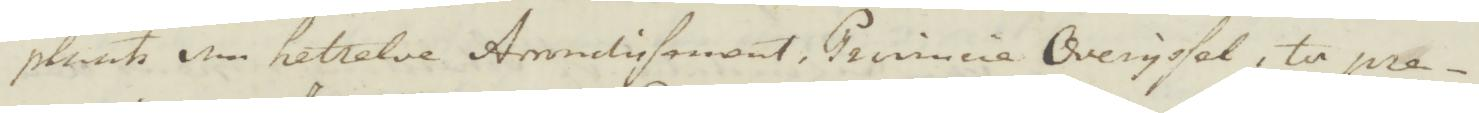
plaats van hetzelve Arrondissement, Provincie Overijssel, ter pre-
